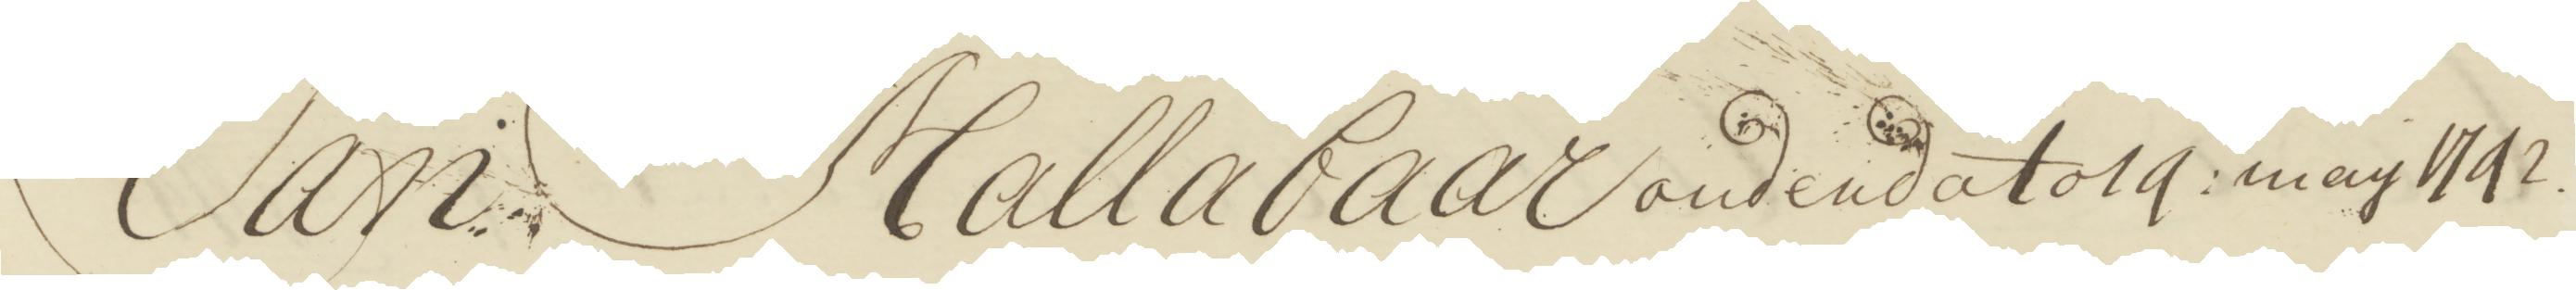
Van Mallabaar onder dato 14:' maij 1742.
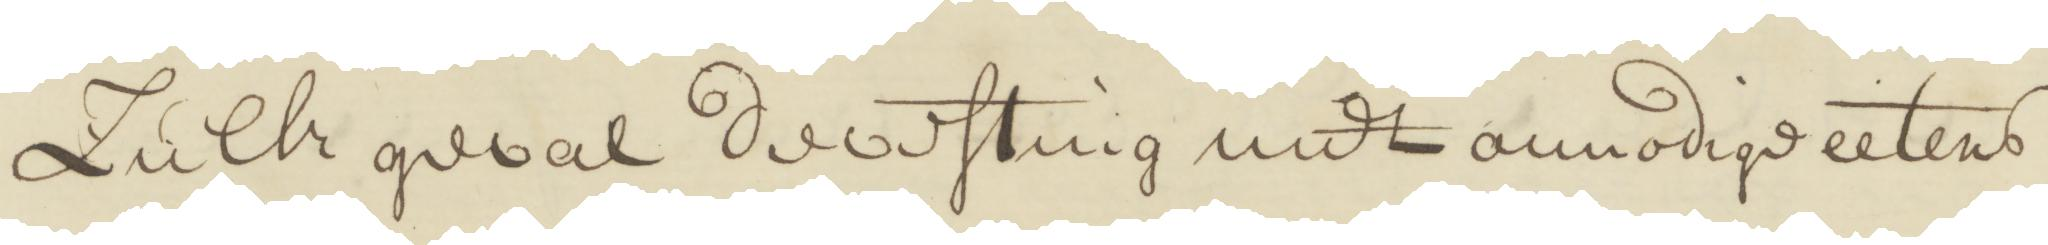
zulk geval de vesting met onnodige eeters
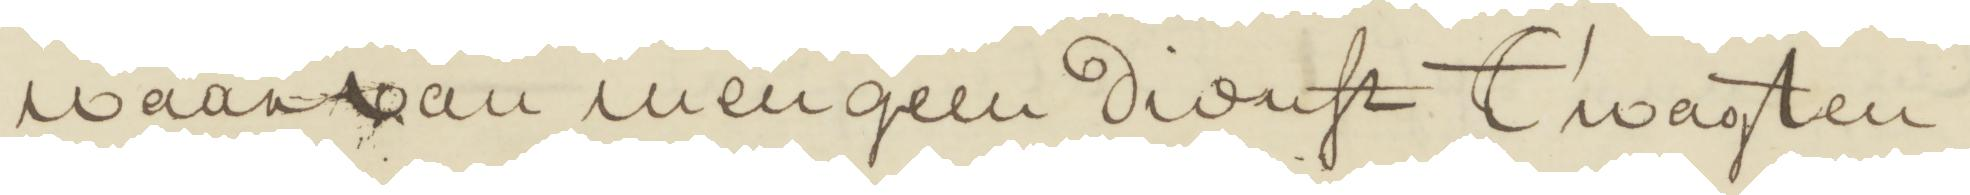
waar van men geen dienst t'wagten
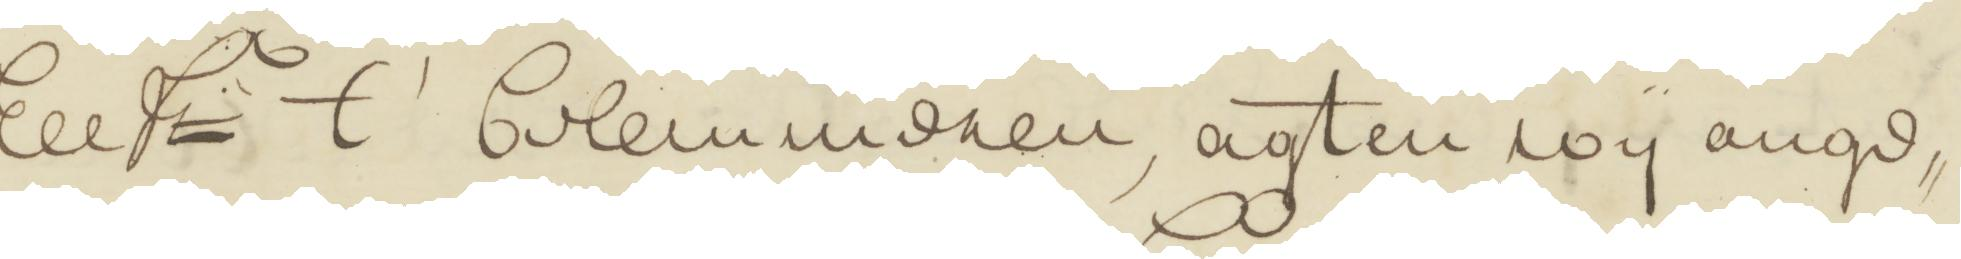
heeft t' belemmeren, agten wij ange„
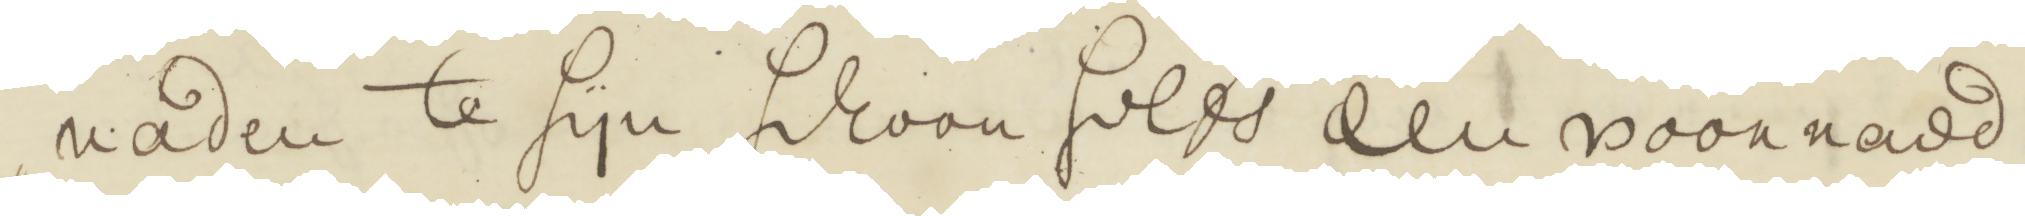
„raden te sijn schoon selfs den voorraed
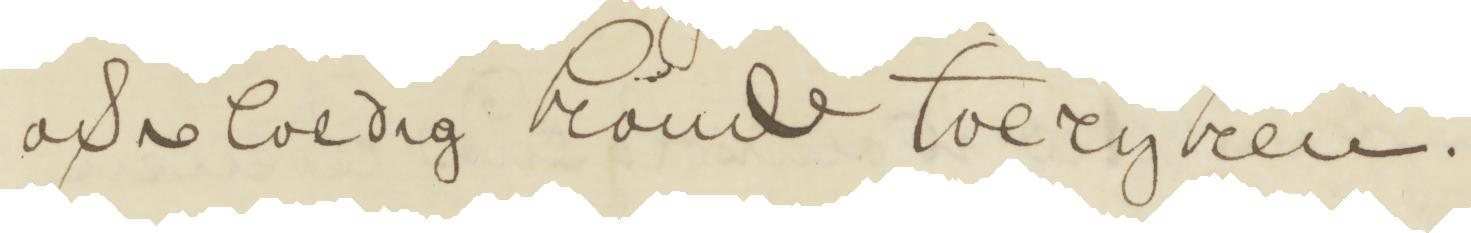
overvloedig konde toerijken.
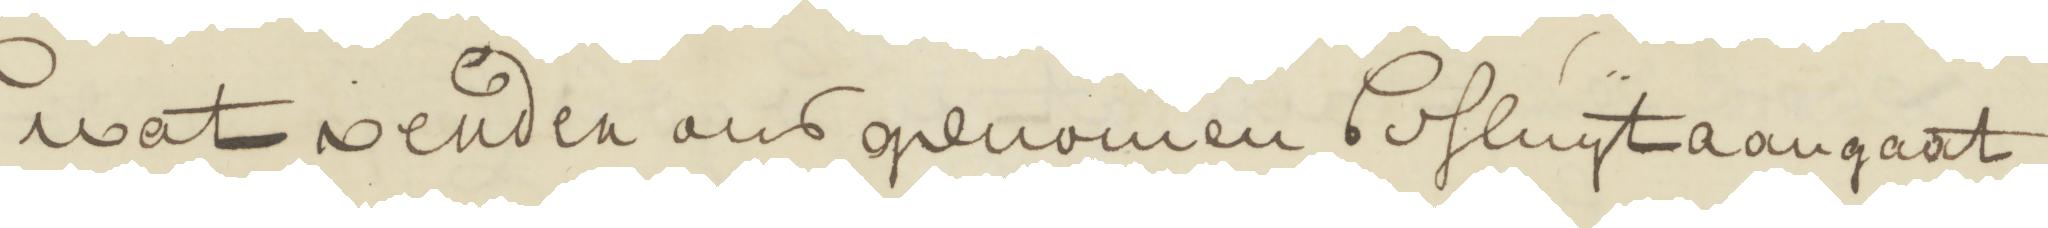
wat verder ons genomen besluijt aangaat
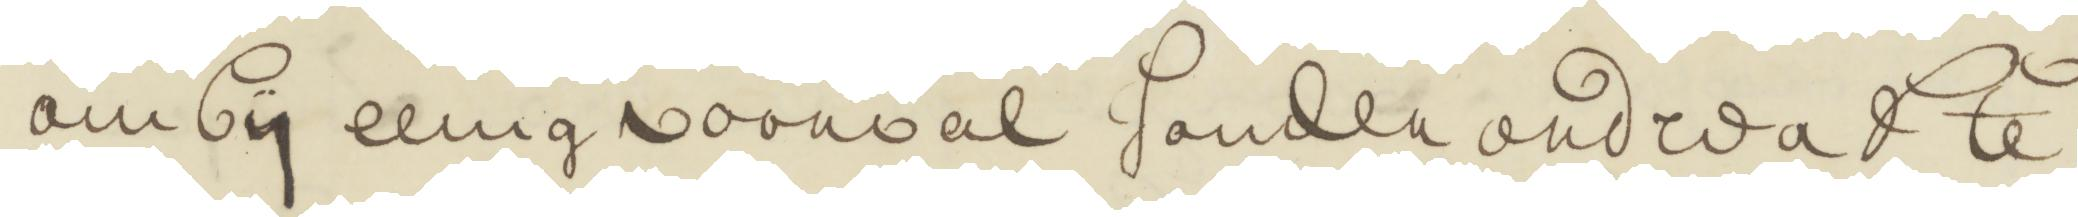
om bij eenig voorval sonder ordre af te
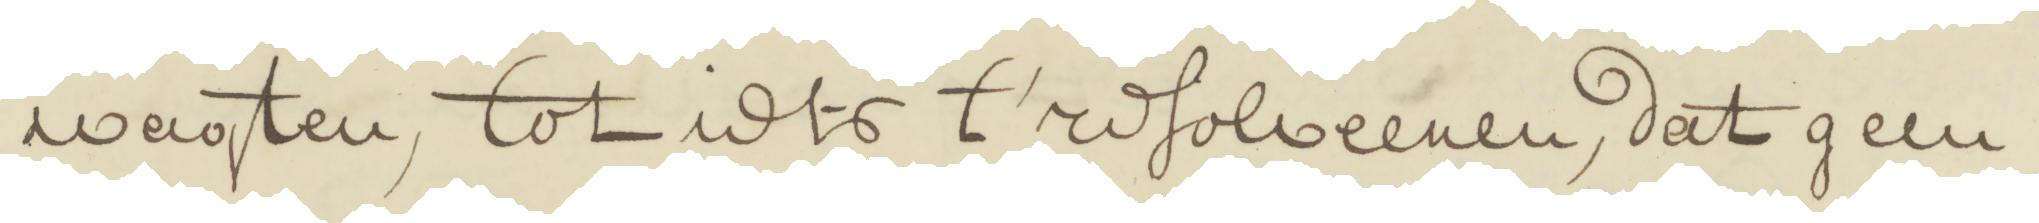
wagten, tot iets t'resolveeren, dat geen
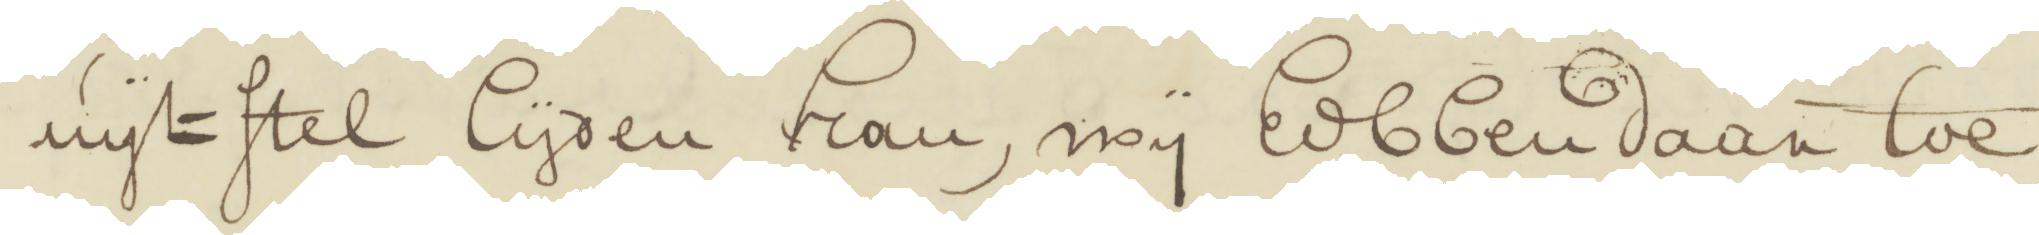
uijtstel lijden kan, wij hebben daar toe
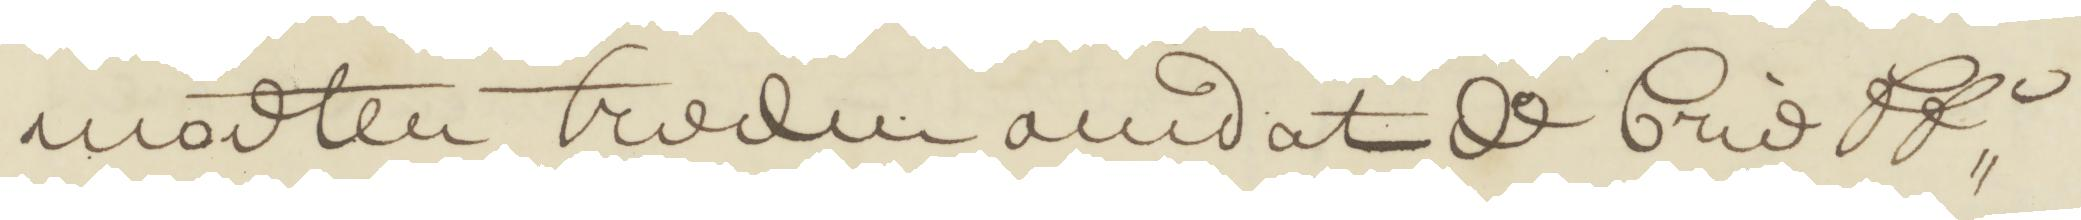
moeten treden omdat de brieff„
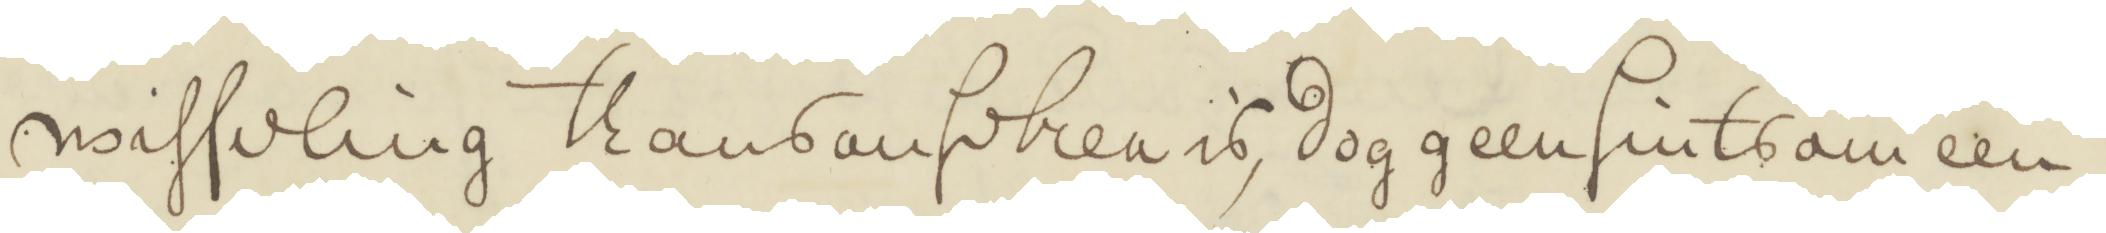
wisseling thans onseker is, dog geensintsom een
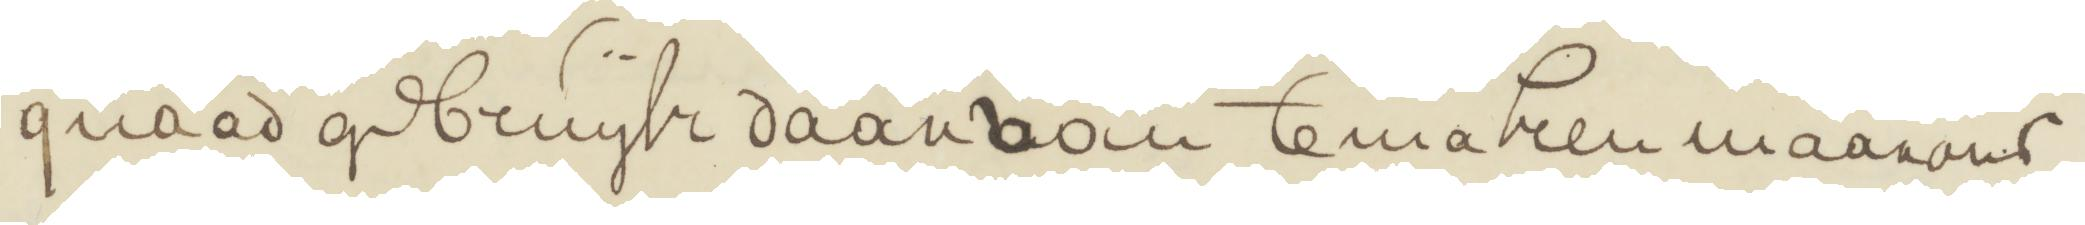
quaad gebruijk daar van te maken maar ons
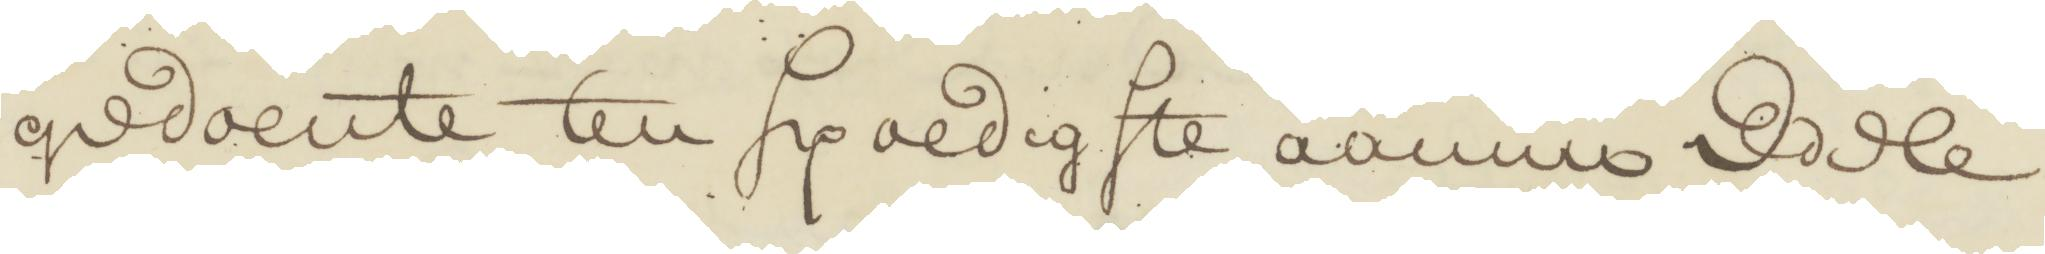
gedoente ten spoedigste aanuw Edele
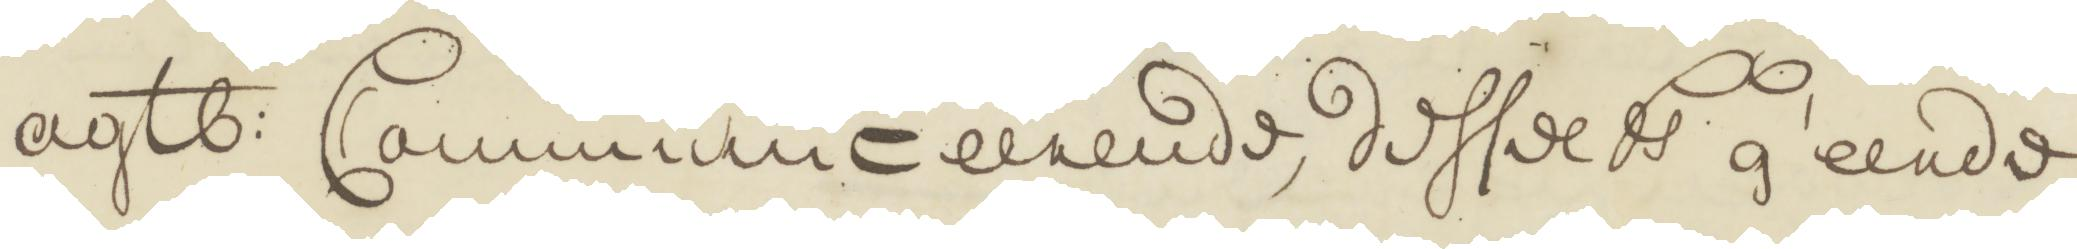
agtb: Communiceerende, desselfs g’eerde
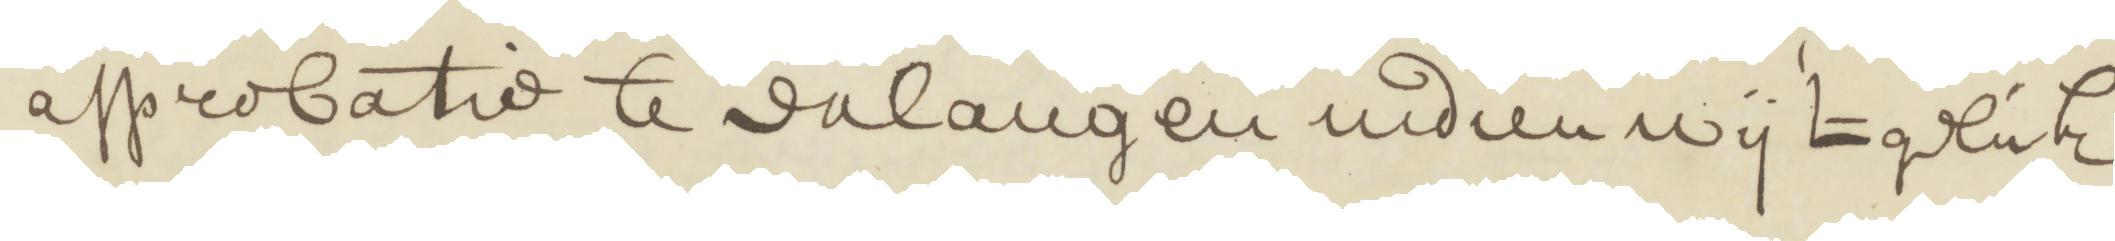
approbatie te erlangen indien wij 't geluk
